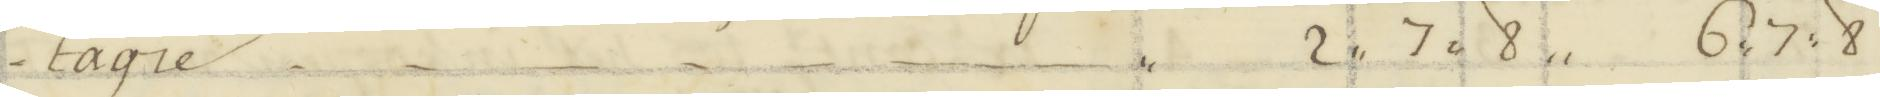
- tagie - - - - - - - - „ 2„ 7„ 8„ 6„7„8
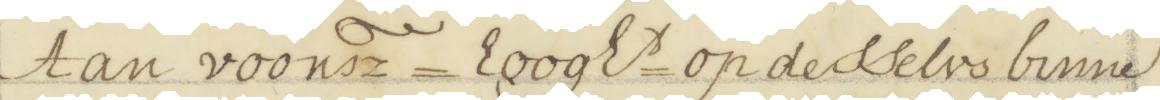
Aan voorsz=e hoogh=t op desselve binne
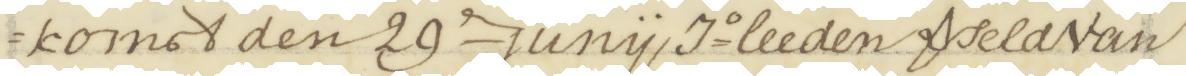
=komst den 29=en Junij I=o leeden verseld van
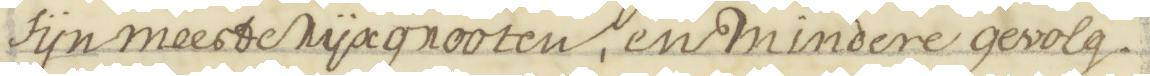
sijn meeste rijxgrooten, en mindere gevolg
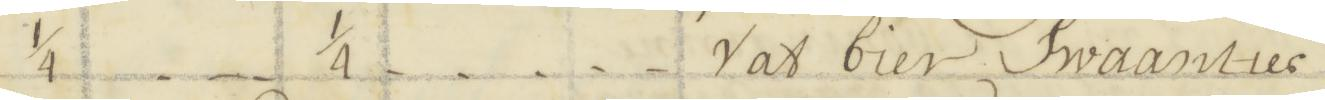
¼ - - - ¼ - - - - - vat bier Swaantier
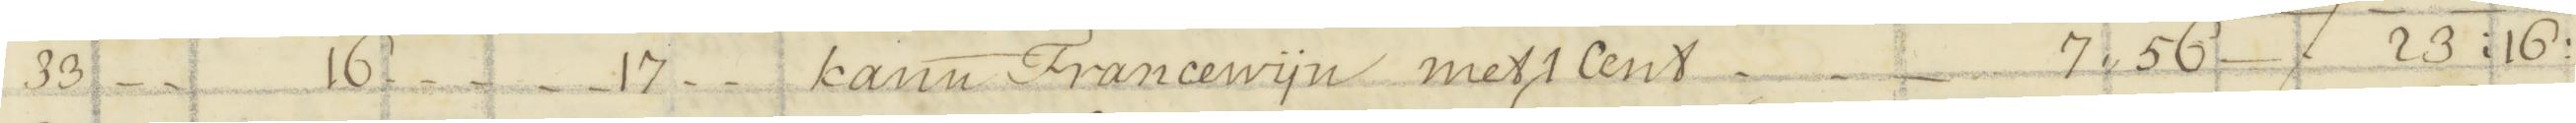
33 - - 16 17- kann Francewijn met 1 cent 7„56—ƒ 23:16:—
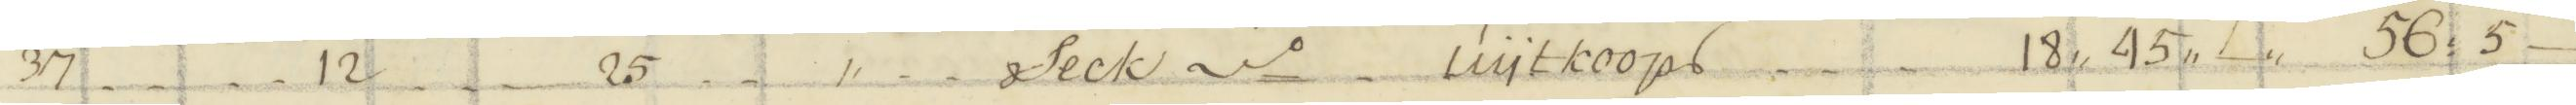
37 - - - - 12 - - - 25 - - „ - - Seck _=o - uijtkoops - - - 18„ 45„ —„ 56: 5
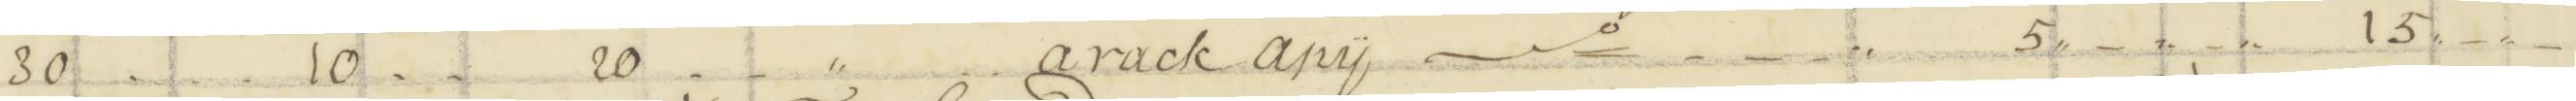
80 . . . 10 - - 20 - - „ . . arack apij _=o - - - „ 5„ — „ - „ 15: — : —
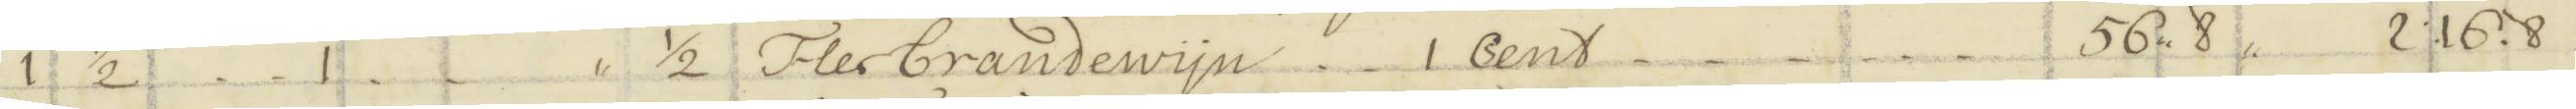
1 ½ - - 1 - - „ ½ Fles brandewijn - - 1 Cent - - - - - - 56„ 8„ 2:16:8
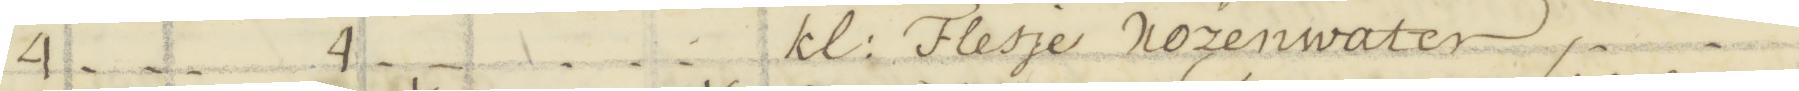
4 - - - 4 - - - - - kl: Flesje rozenwater, - -
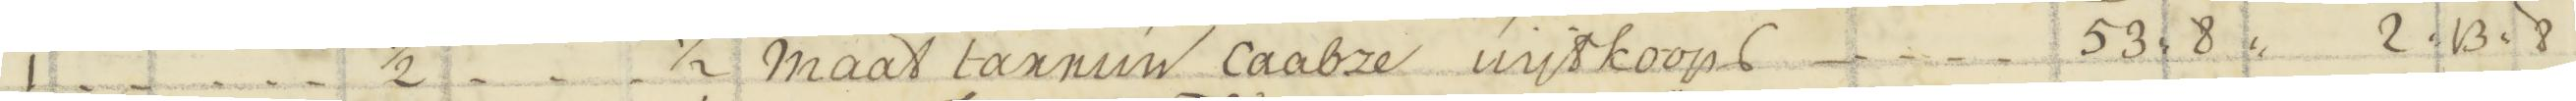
1 - - - - - ½ - - - ½ maat tarrun caabze uijtkoops - - - - 53„ 8 „ 2: 13: 8
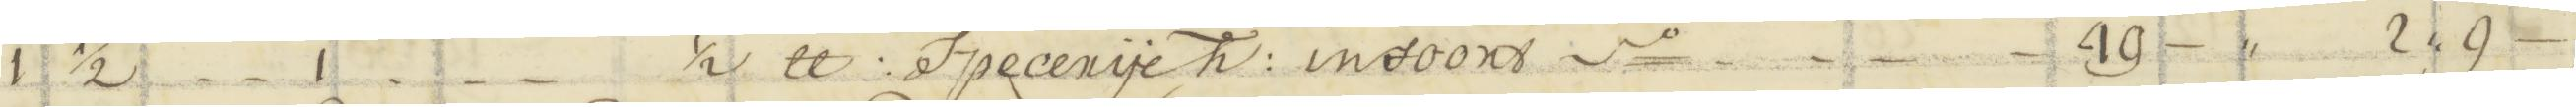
1 ½ - - 1 - - - ½ lb: specerije h: insoort _=o - - - - 49 — „ 2 „ 9 —
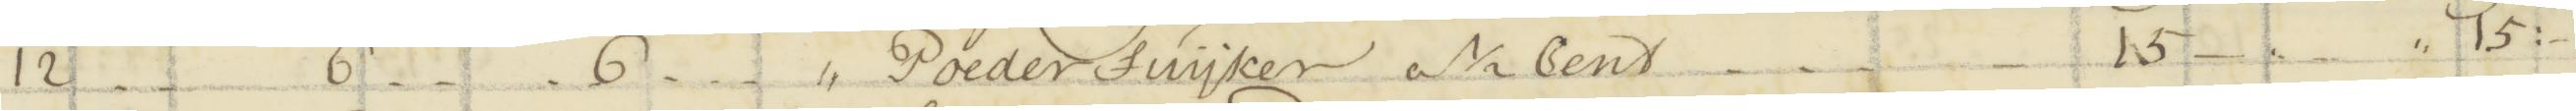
12 - - 6 - - - - 6 - - - „ Poeder suijker a ½ Cent - - - - 15 — „ „ 15:-
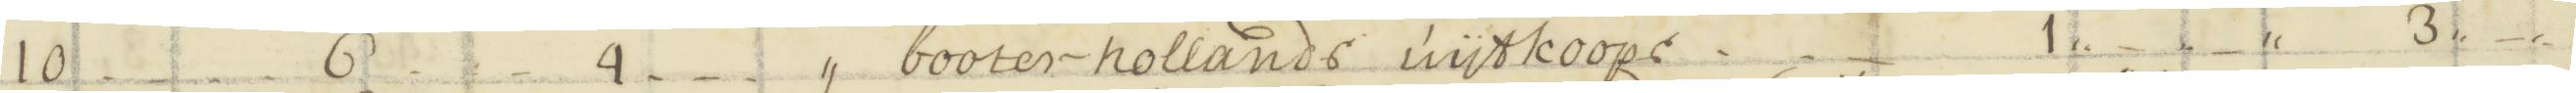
10 - - - - 6 - - - 4 - - - „ booter hollands uijtkoops - - - 1„ — „ — „ 3„ — „
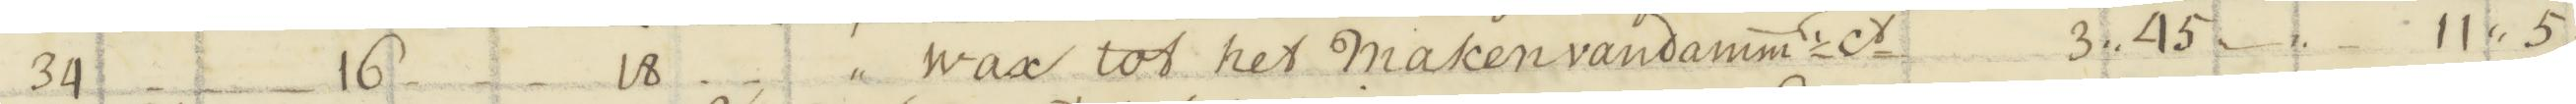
34 - - - 16 - - - 18 - - „ wax tot het maken van damm ½ c=s 3 „ 45 „ — „ - 11 „ 5
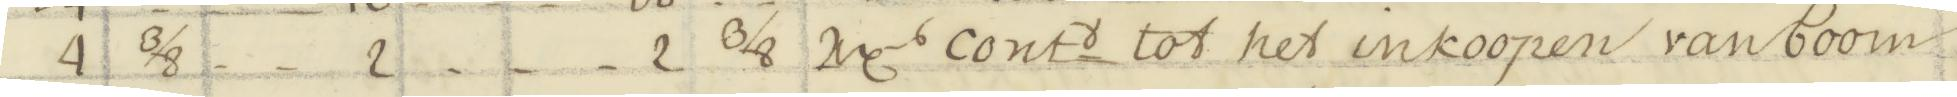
4 3/8 - - 2 - - - 2 3/8 rxs cont=s tot het inkoopen van boom
